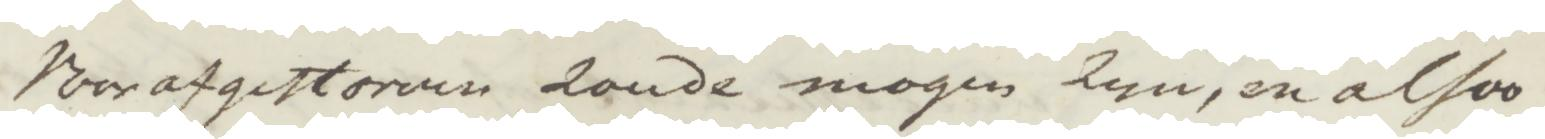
Voor afgestorven zoude mogen zyn, en alsoo
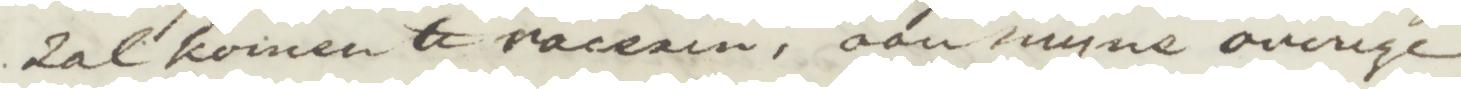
zal komen te vaceren, aan myne overige
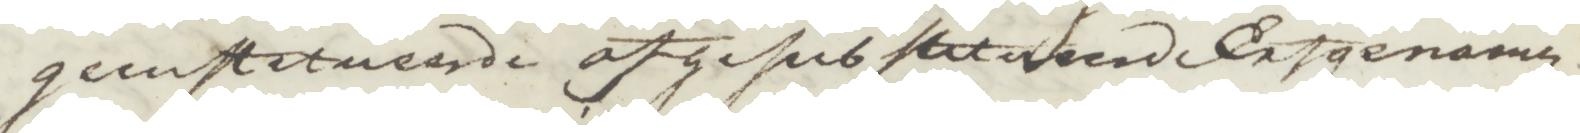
geinstitueerde of gesubstitueerde Erfgenamen
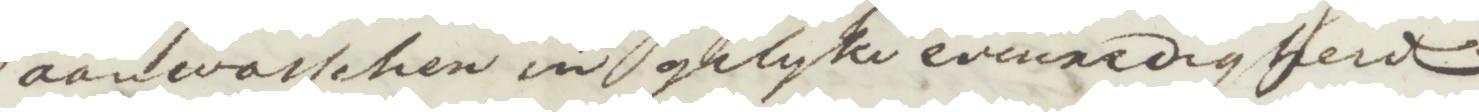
aanwasschen in gelyke evenredigheid
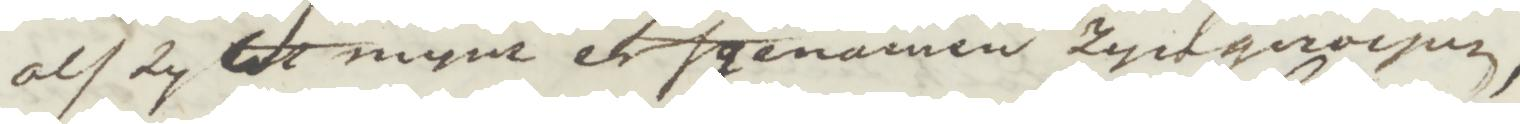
als zy tot myne erfgenamen zyn geroepen,
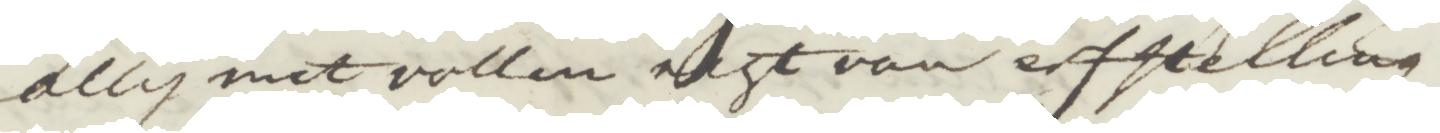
alles met vollen regt van erfstelling.
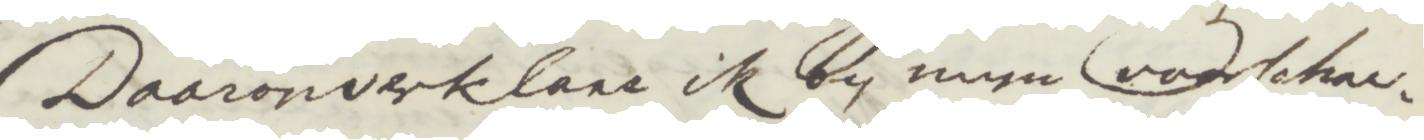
Daarom verklare ik by myn voorschre„
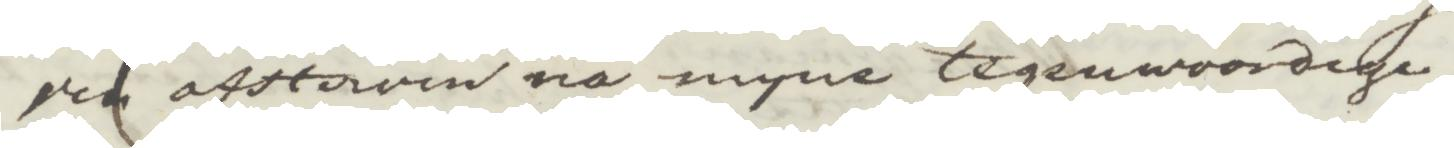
ven afsterven na myne tegenwoordigen
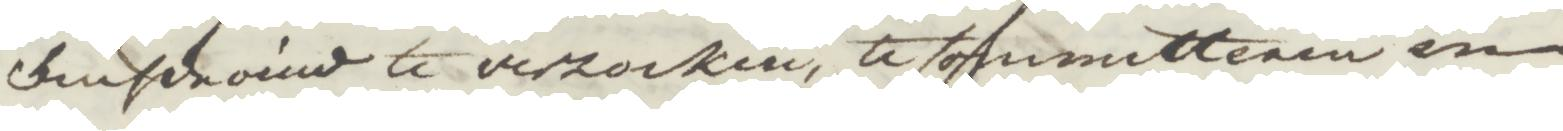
huisvrouw te verzoeken, te committeren en
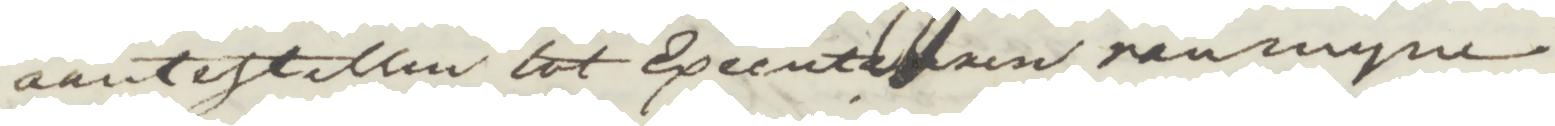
aantestellen tot Executeuren van myne
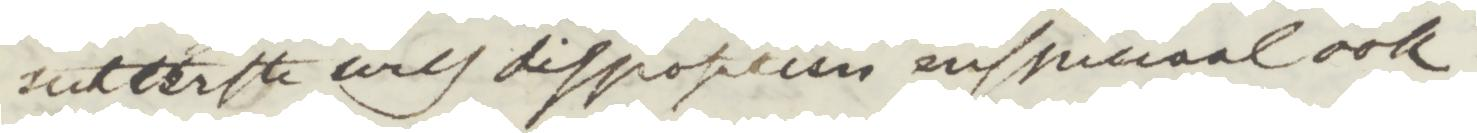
uitterste wils dispositien en speciaal ook
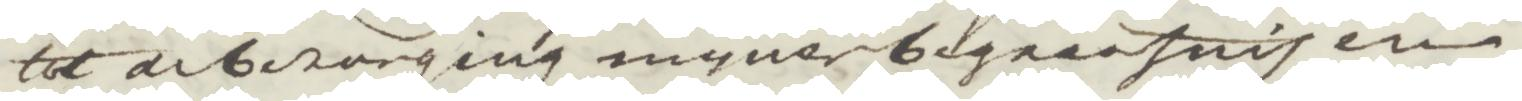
tot de bezorging myner begraafnis en
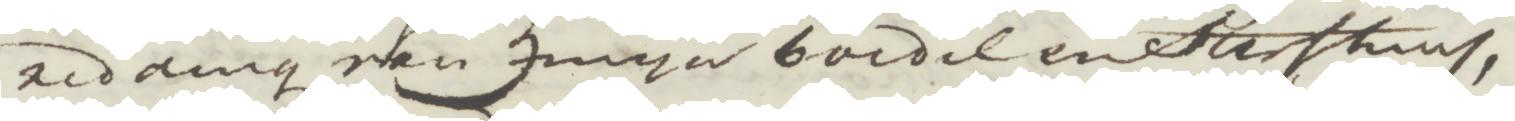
redding van myn boedel en sterfhuis,
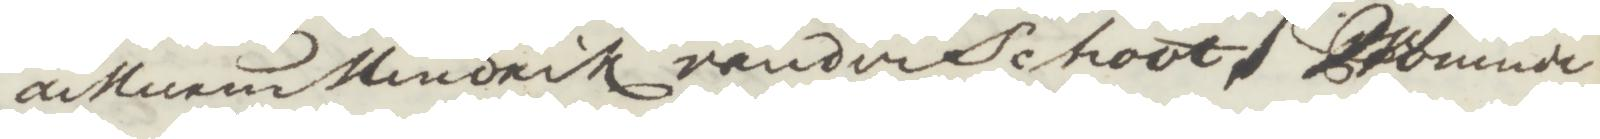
de Heeren Hendrik van der Schoot, Brouwer
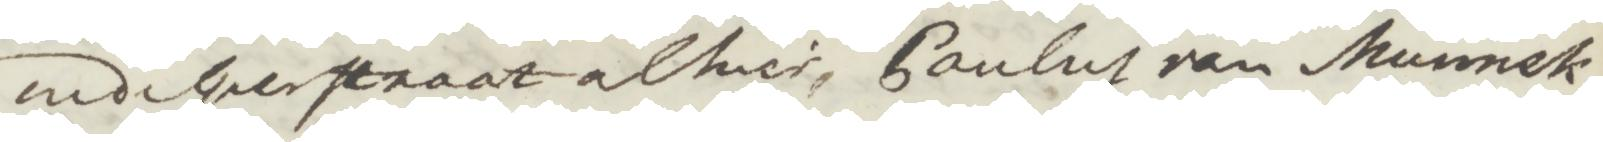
in de Gierstraat alhier, Paulus van Munnek
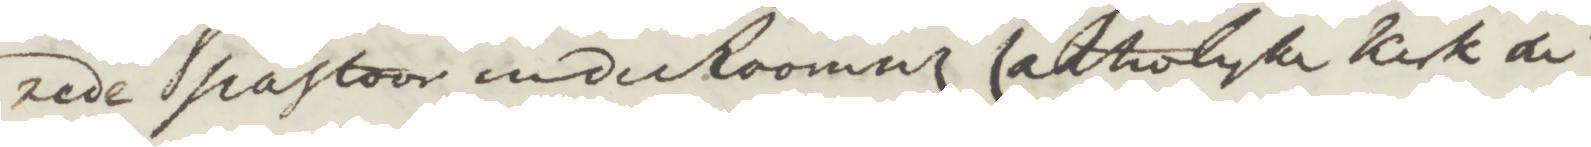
rede pastoor in de Roomsch Catholyke kerk de
